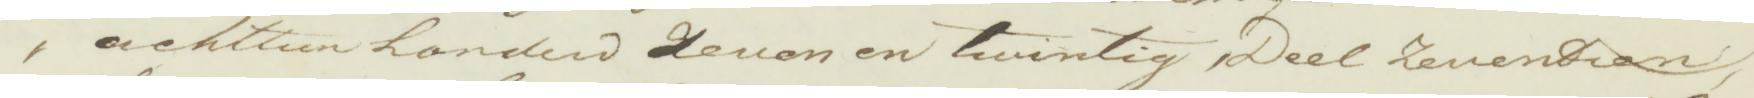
„ achttien honderd zeven en twintig, Deel zeventien,
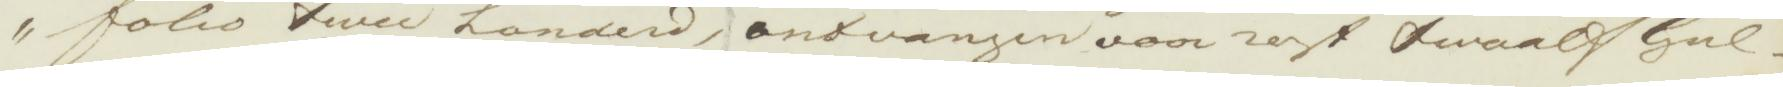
„ folio twee honderd, ontvangen voor regt Twaalf Gul
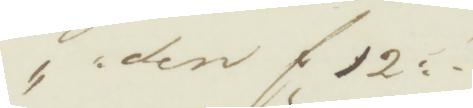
„ „den ƒ 12: -
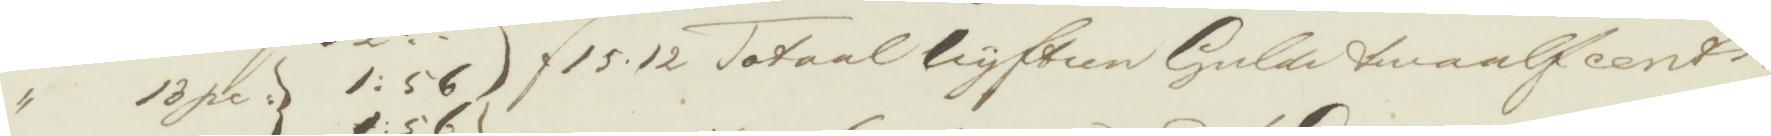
„ 13pc : 1:56 ƒ15.12 Totaal Vijftien Gulde twaalf cents
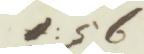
1:56
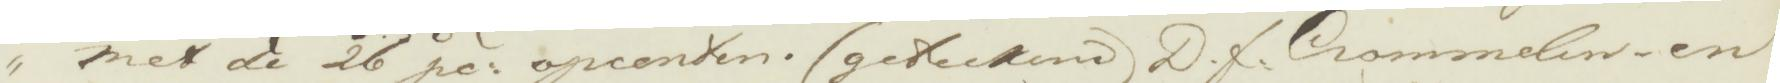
„ met de 26 pc: opcenten. (geteekend) D.f. Crommelin - en
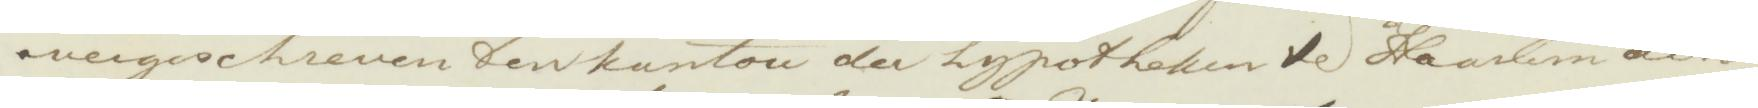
overgeschreven ten kantore der hypotheken te Haarlem den
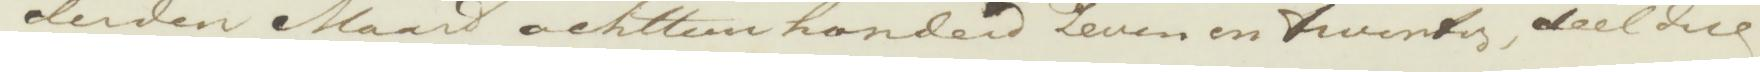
derden Maart achttien honderd Zeven en twintig, deel drie
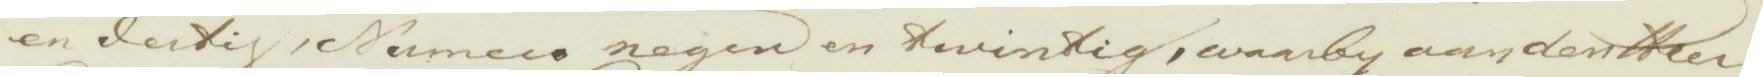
en dertig, Numero negen en twintig, waarby aan den Heer
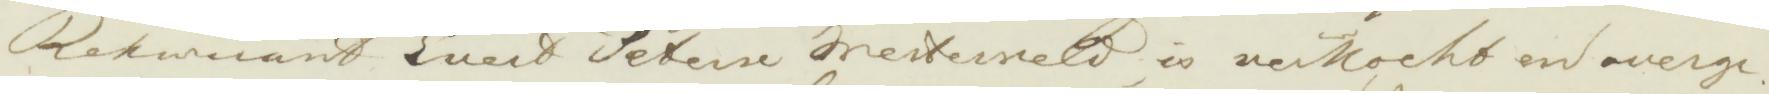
Rekwirant Evert Peterse Westerveld is verkocht en overge
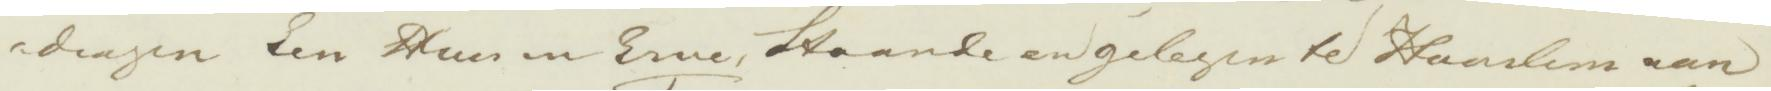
„dragen Een Huis en Erve, staande en gelegen te Haarlem aan
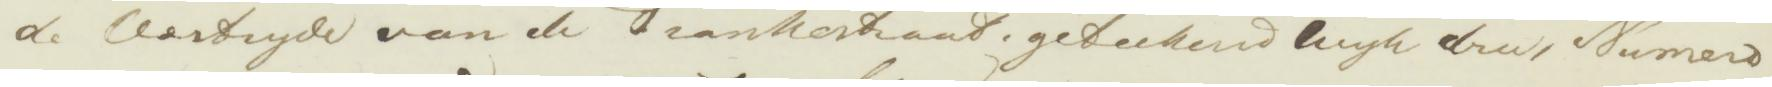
de Oostzyde van de Frankestraat, geteekend wyk drie, Numero
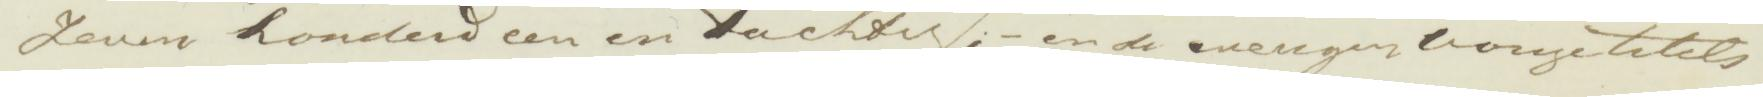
zeven honderd een en tachtig; - en de overigen vorige titels
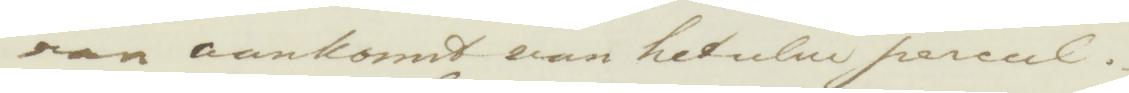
van aankomst van hetzelve perceel.
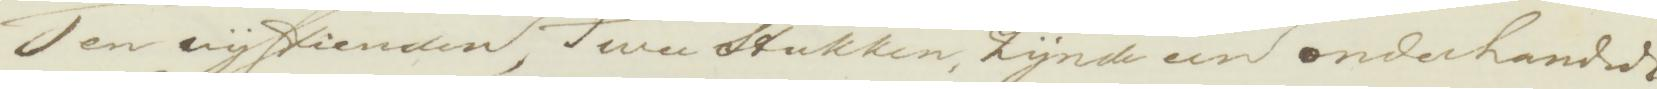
Ten vijftienden, Twee stukken, Zijnde een onderhandsch
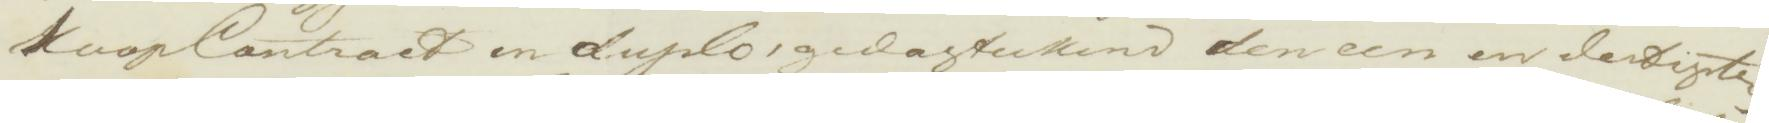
koop Contract in duplo, gedagteekend den een en dertigsten
